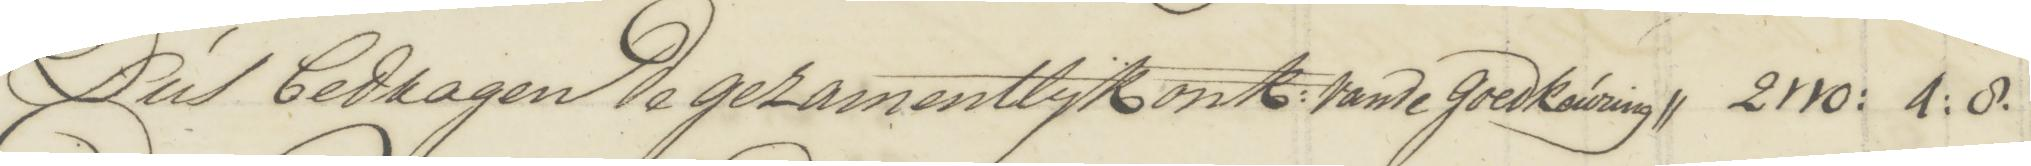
Dus bedragen de gezamentlijk onk: vande goedkeuring „ 2110: 4: 8.
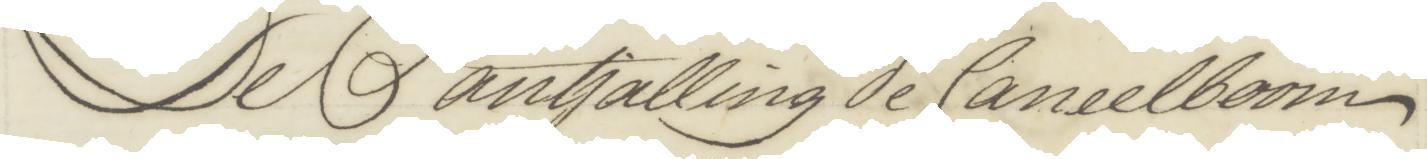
De Pantjalling de Caneelboom
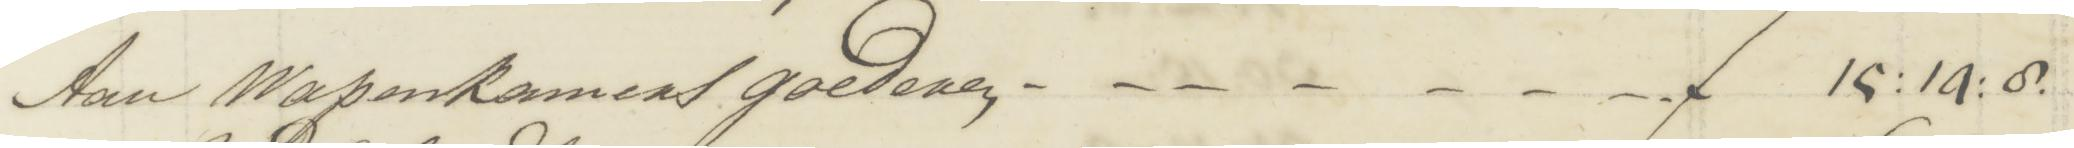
Aan Wapenkamers goederen – — — — — — — - ƒ 15: 14: 8.
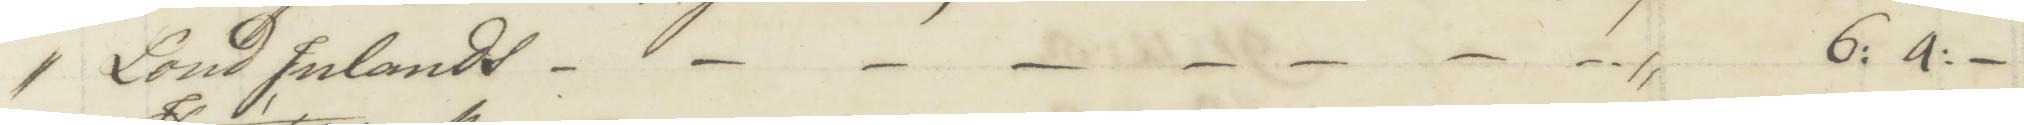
„ Lond Jnlands – — — — — — — – - „ 6: 4: –
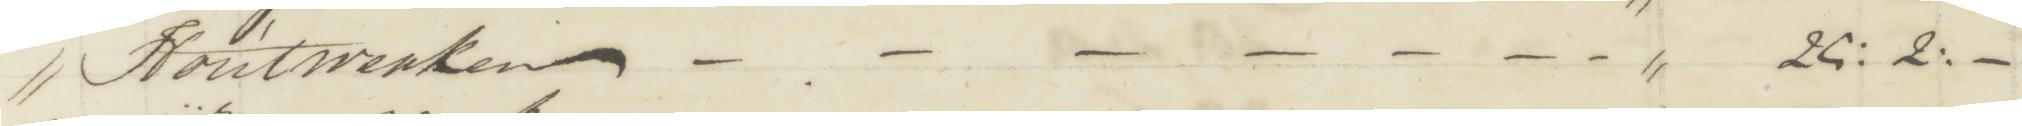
„ Houtwerken — — — — — — – „ 25: 2: –
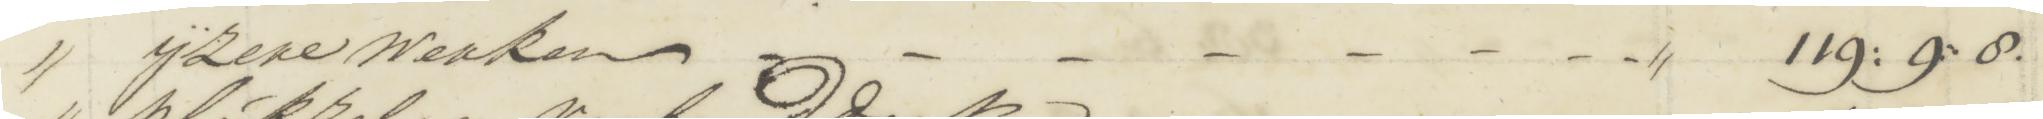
„ ijzere werken – – – – – – – – „ 119: 9: 8.
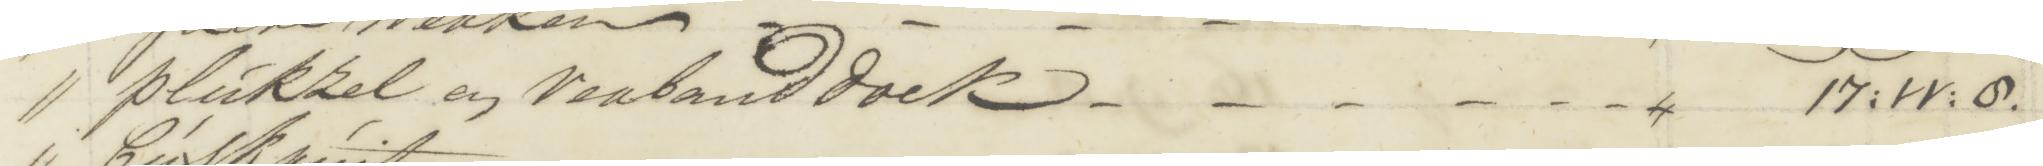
„ plukzel en verband doek – — — – – – „ 17: 11: 8.
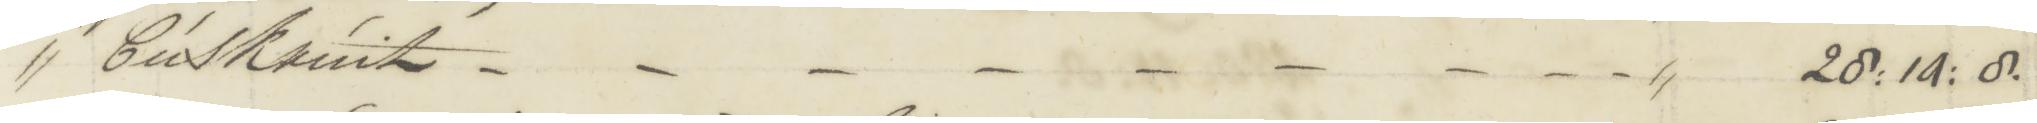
„ buskruit – — — — — — — — — – „ 28: 14: 8.
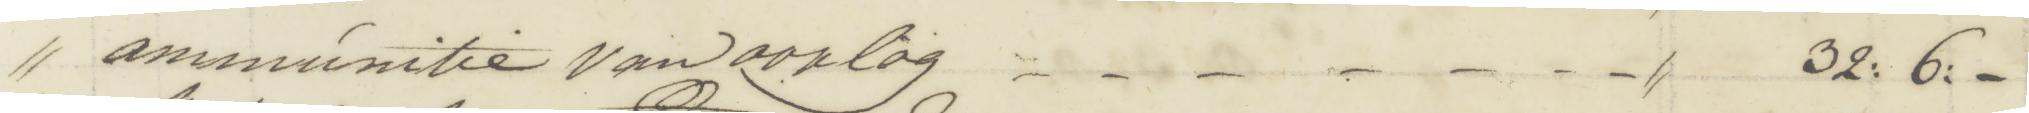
„ ammunitie van oorlog – – – – – – – „ 32: 6: –
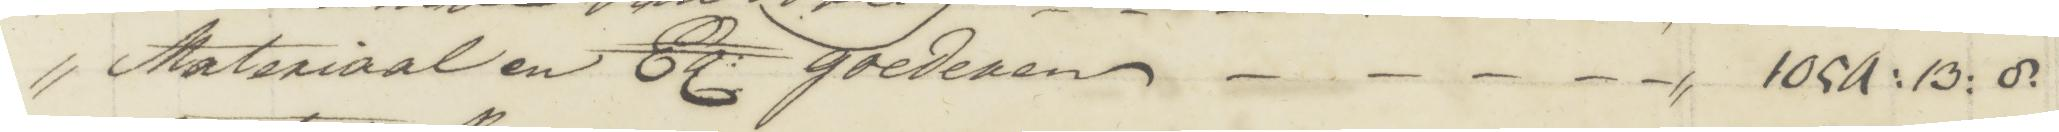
„ Materiaal en Eq: goederen — — — — –„ 1054: 13: 8.
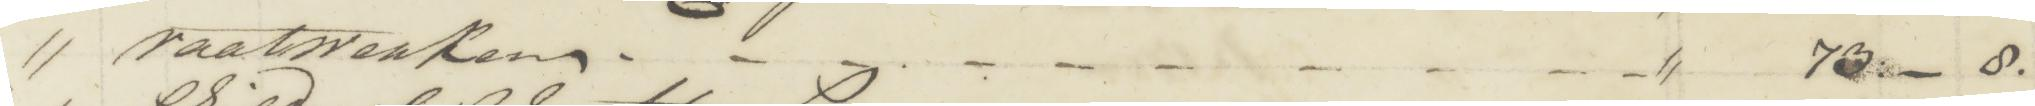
„ raatwerken - – – – – – – – – – „ 73: — 8.
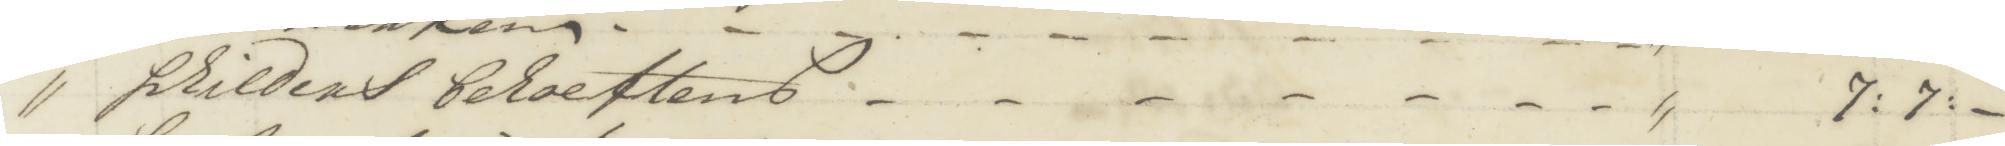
„ schilders behoeftens – – – – – – – „ 7: 7: —
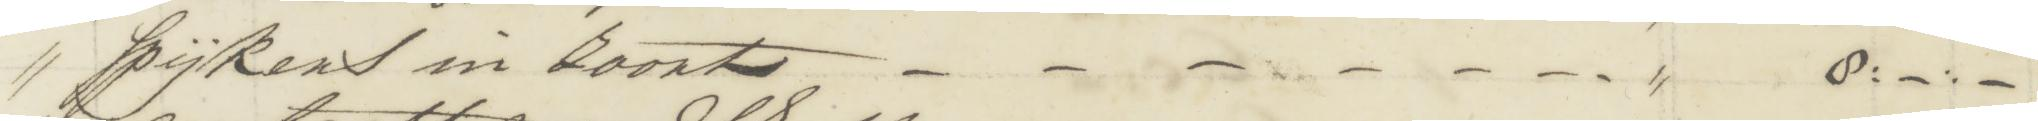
„ spijkers in zoort — — — — — — - „ 8: — : —
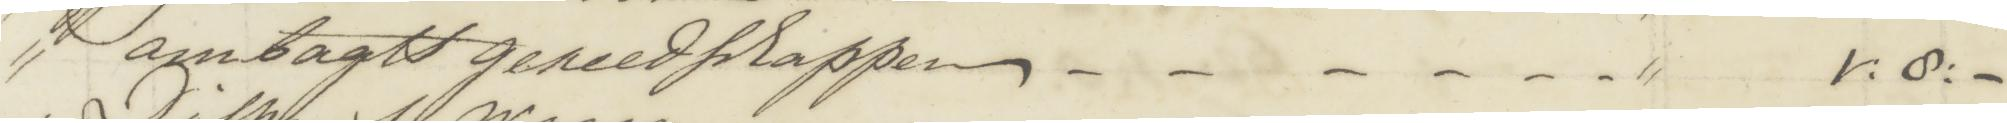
„ ambagts gereedschappen – – – – – - „ 1: 8: –
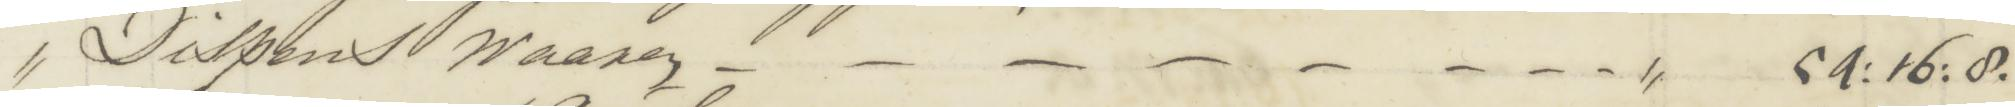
„ Dispens waaren – — — — — — — – „ 54: 16: 8.
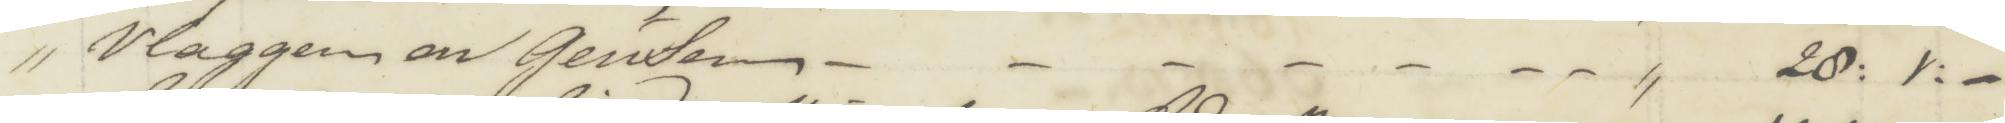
„ vlaggen en Geusen — — – – – – – „ 28: 1: –
